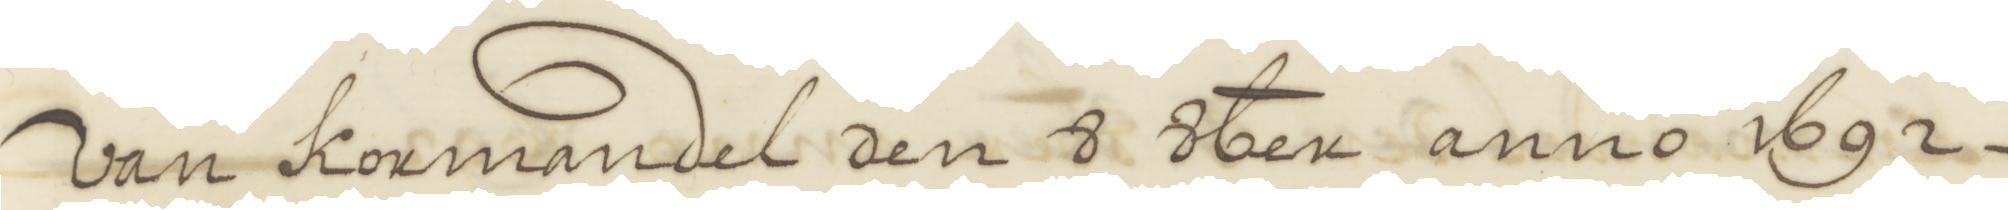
van kormandel den 8 8ber anno 1692
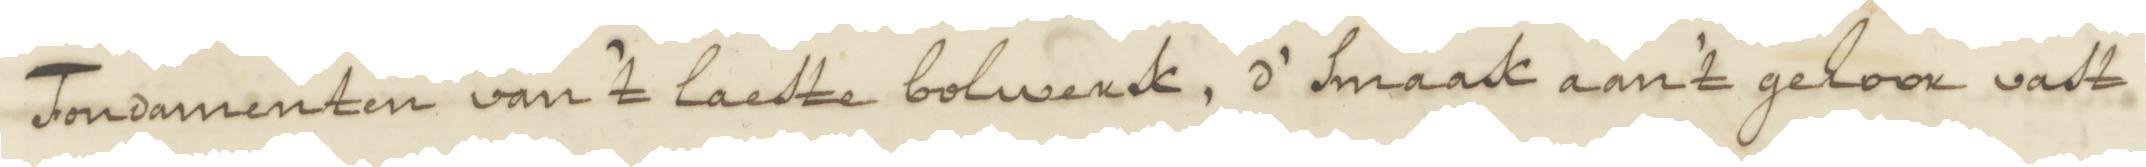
Fondamenten van ’t laeste bolwerk, d’ smaak aan ’t gehoor vast
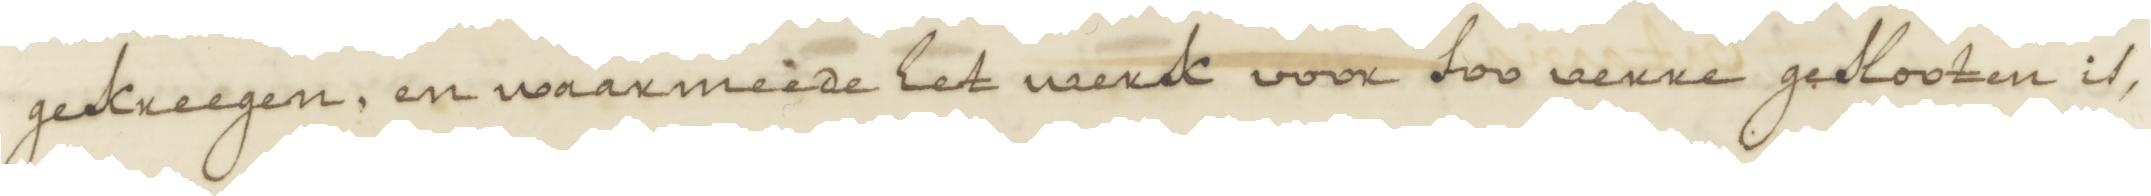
gekreegen, en waarmeede het werk voor soo verre geslooten is,
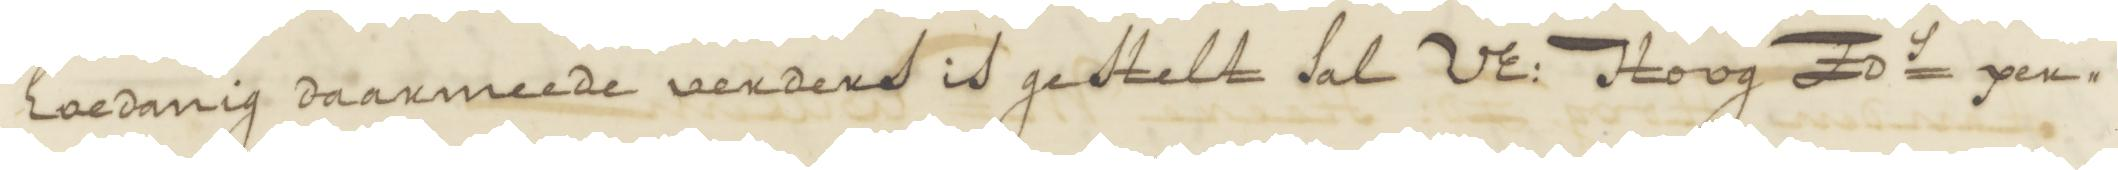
hoedanig daarmeede verders is gestelt sal UE: Hoog Ed=s per„
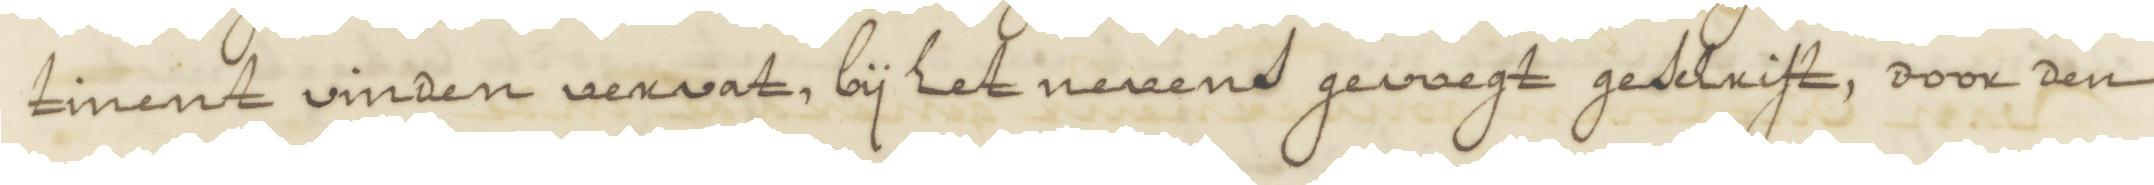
tinent vinden vervat, bij het nevens gevoegt geschrift, door den
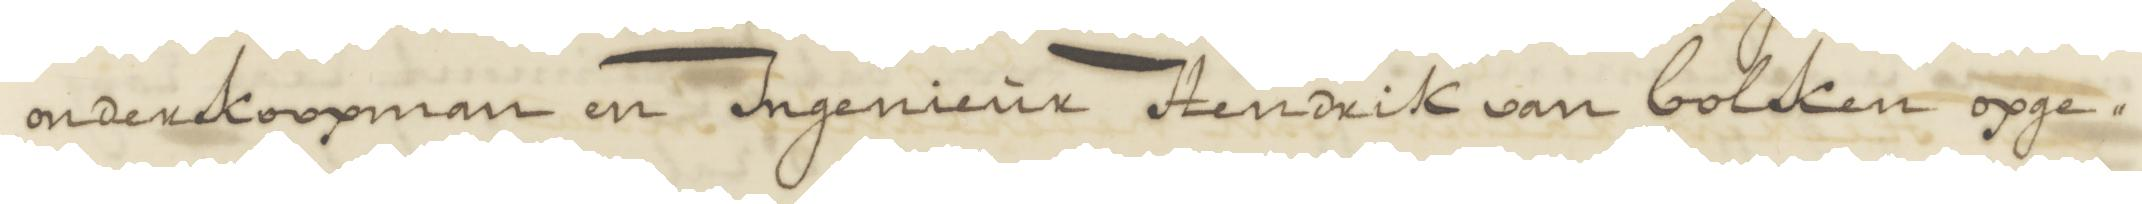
onderkoopman en Ingenieur Hendrik van bolken opge„
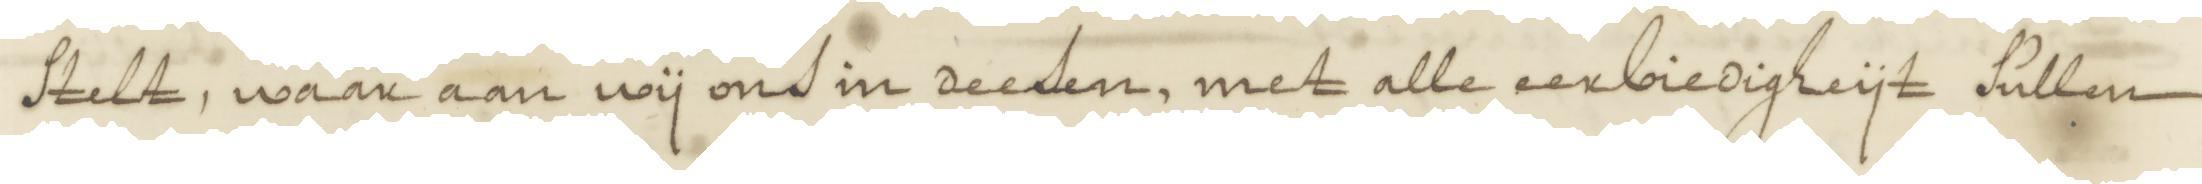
stelt, waar aan wij ons in deesen, met alle eerbiedigheijt sullen
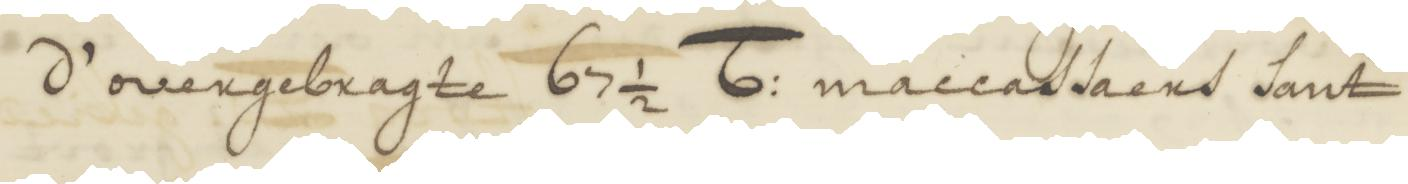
d’ overgebragte 67½ T: maccassaers sant
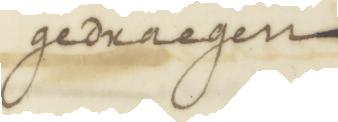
gedraegen
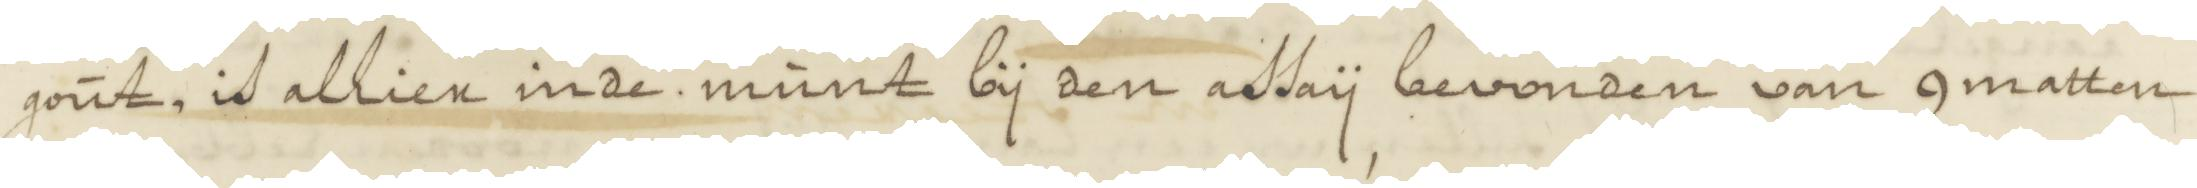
gout, is alhier inde munt bij den assaij bevonden van 9 matten
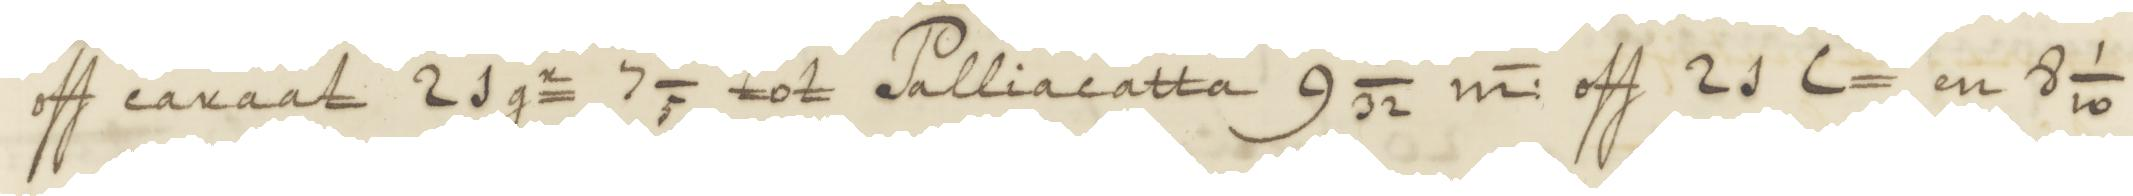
off caraat 21 g=r 7 1/5 tot Palliacatta 9 1/32 m: off 21 C=t en 8 1/10
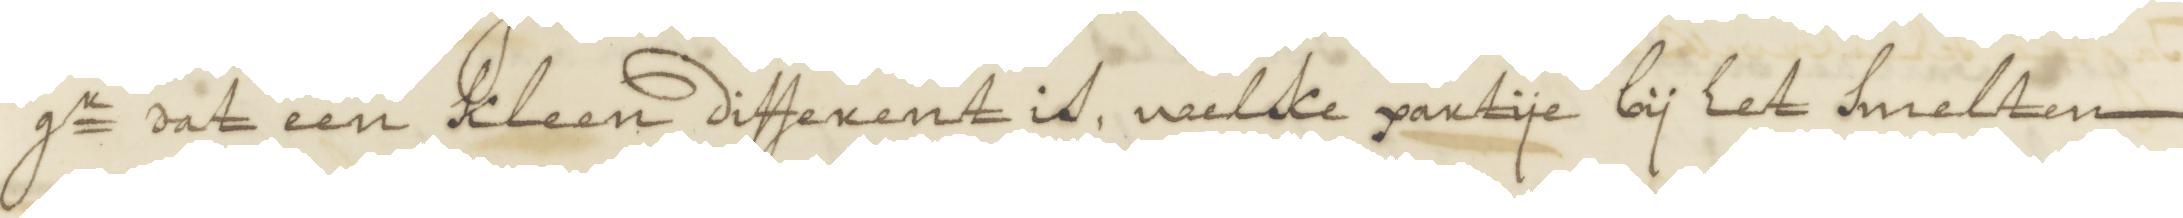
g=r dat een kleen different is, welke partije bij het smelten
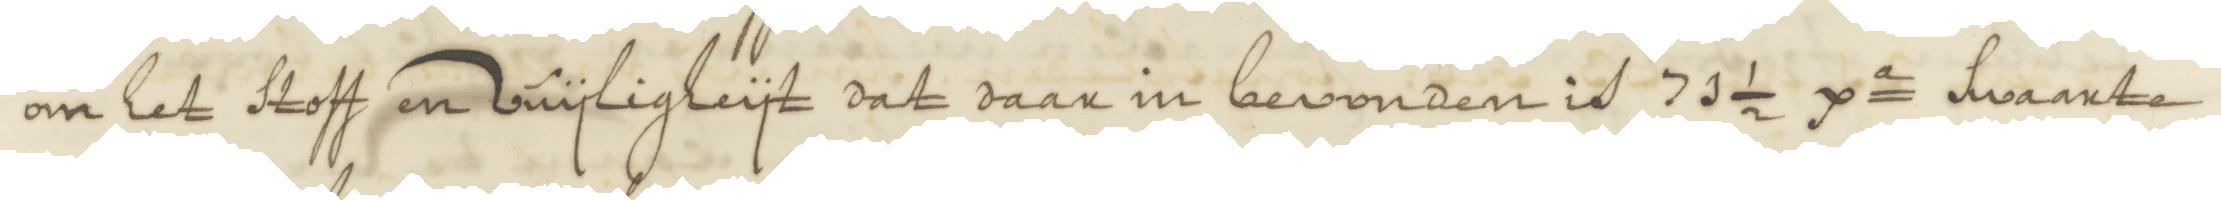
om het stoff en vuijligheijt dat daar in bevonden is 73½ p=a swaarte
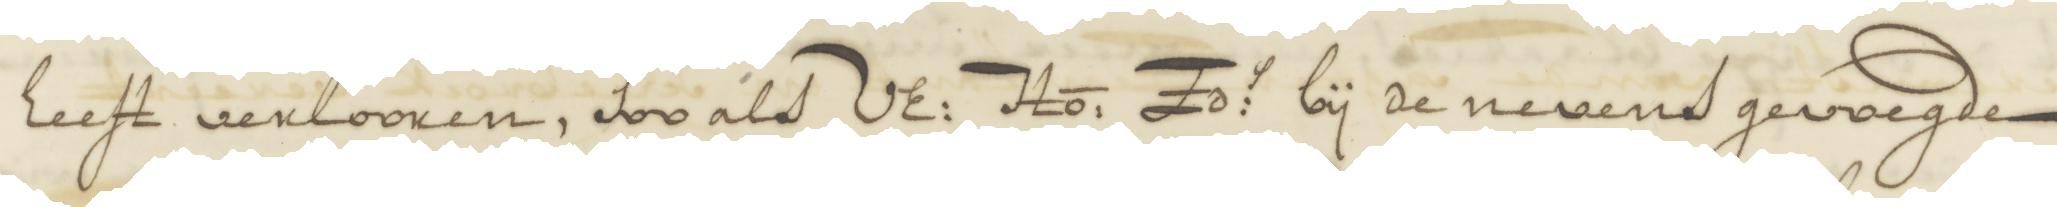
heeft verlooren, soo als VE: Ho: Ed:s bij de nevens gevoegde
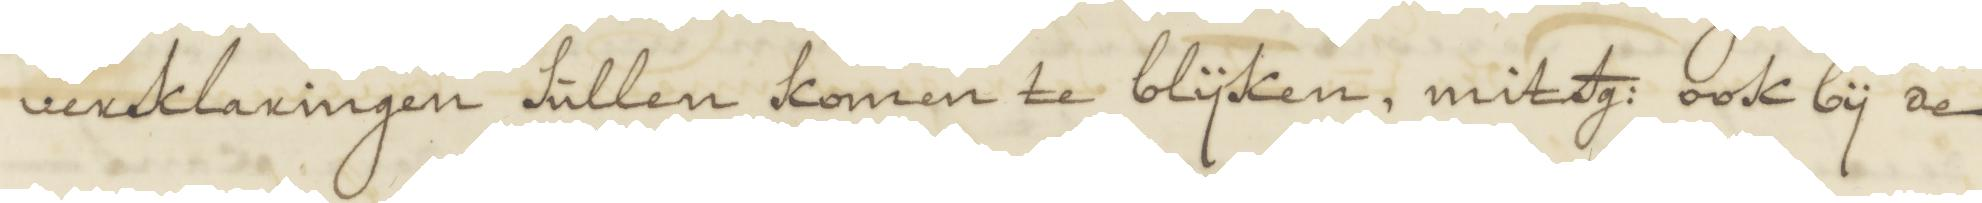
verklaringen sullen komen te blijken, mitsg: ook bij de
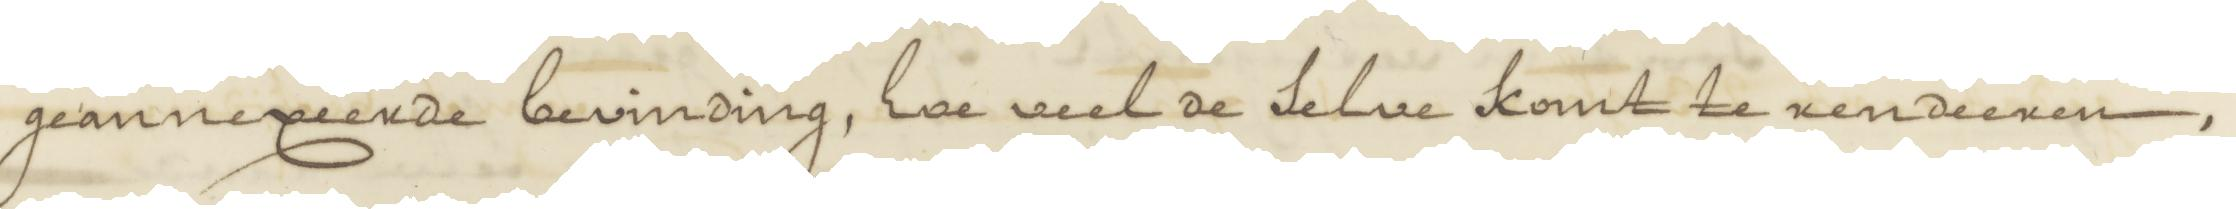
geannexeerde bevinding, hoe veel de selve komt te rendeeren,
